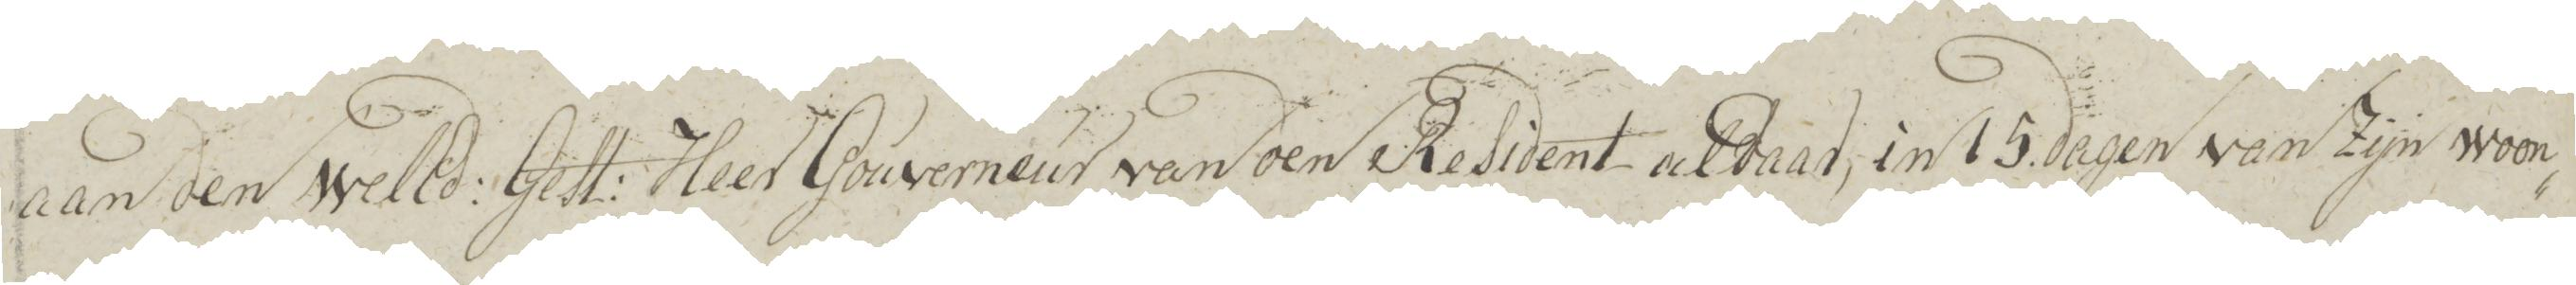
aan den wel Ed: Gest: Heer Gouverneur van den Resident aldaar, in 15. dagen van Zijn woon„
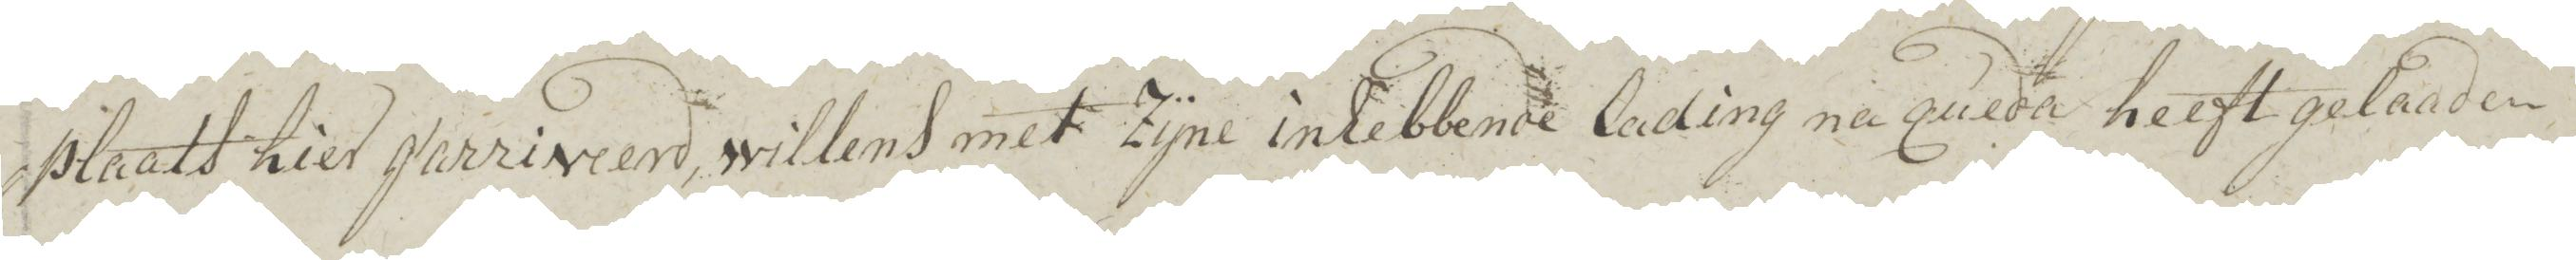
„plaats hier g’arriveerd, willens met Zijne in hebbende lading na queda heeft gelaaden
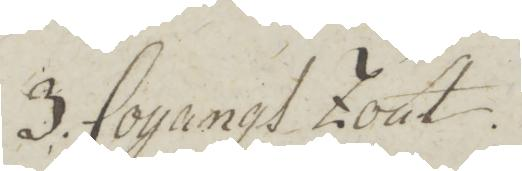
3: Coyangs Zout.
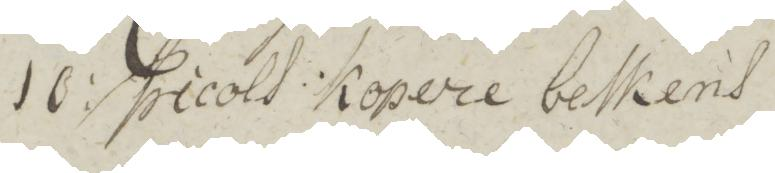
10: picols kopere bekkens
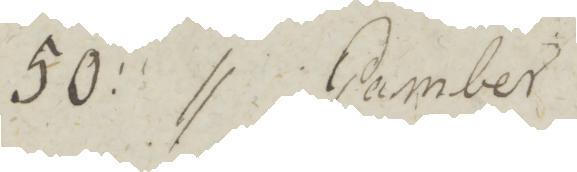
50: „ Gamber
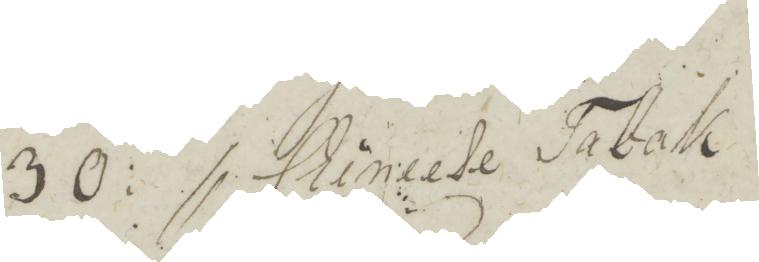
30: „ Chineese Tabak
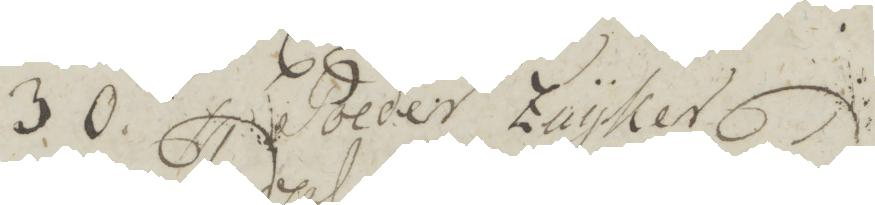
30. „ Poeder Zuijker
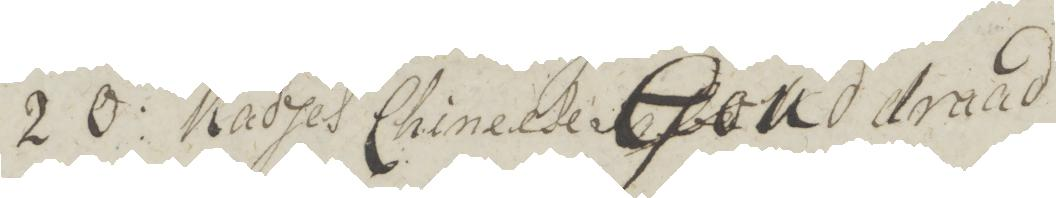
20: kadjes Chineese Goud draad
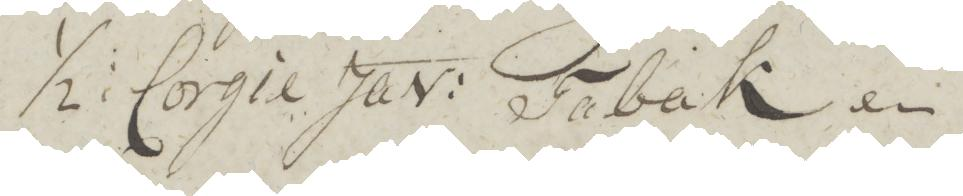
½: Corgie Jav: Tabak en
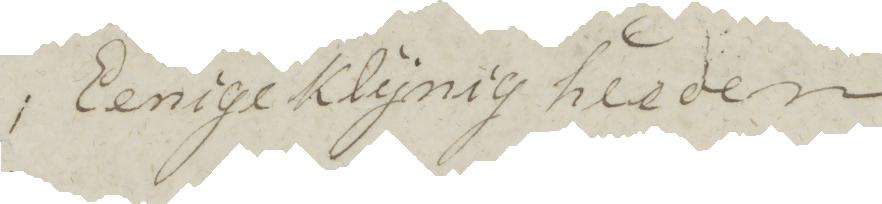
„ Eenige Klijnig heeden
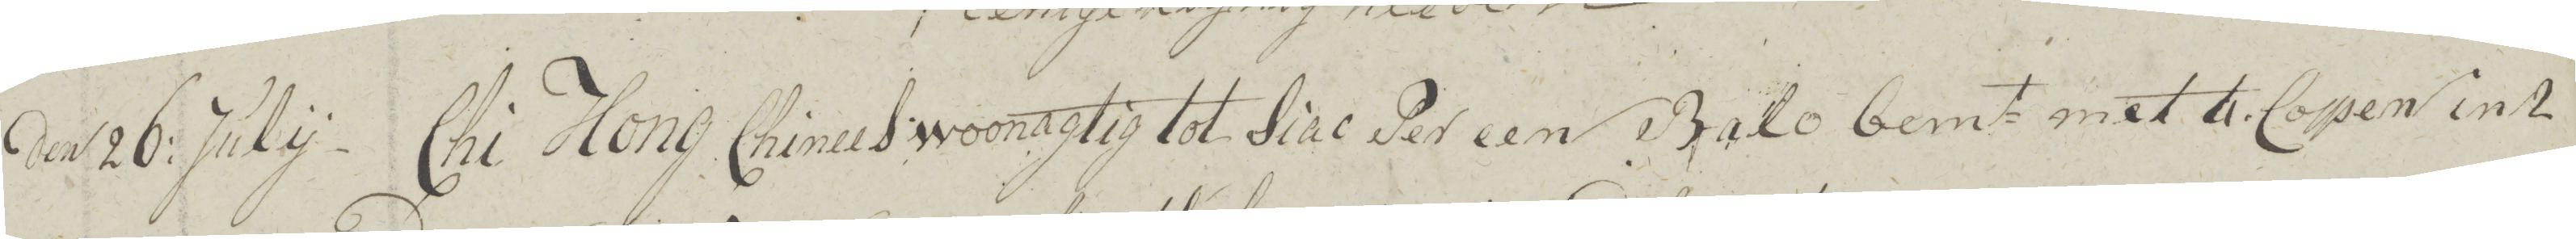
den 26: Julij - Chi Hong Chinees woonagtig tot Siac Per een Balo bem=t met 4. Coppen in 2
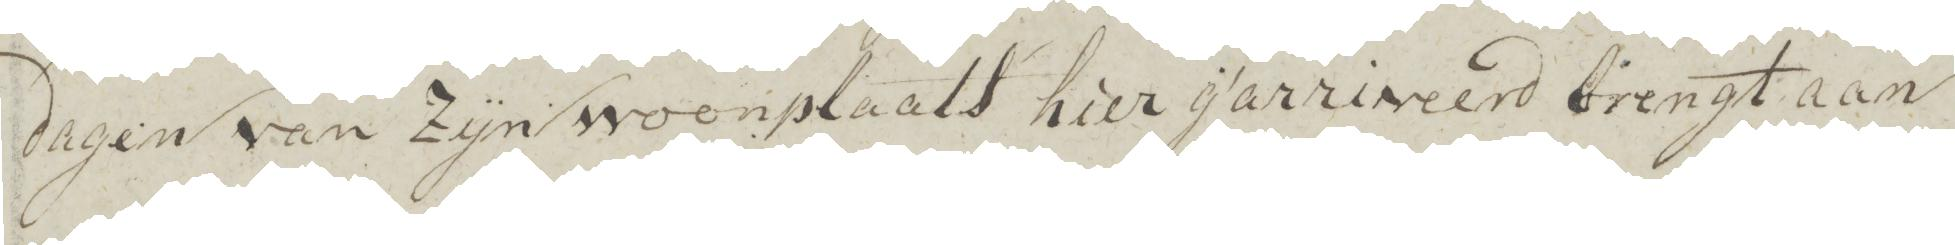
dagen van Zijn woonplaats hier g’arriveerd brengt aan
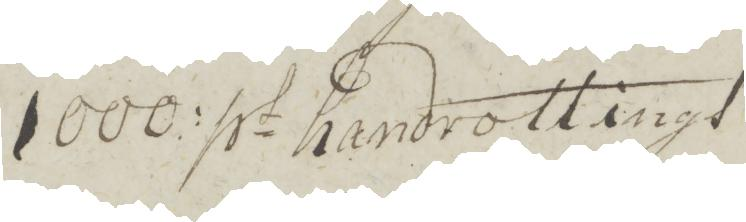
1000: p=s handrottings
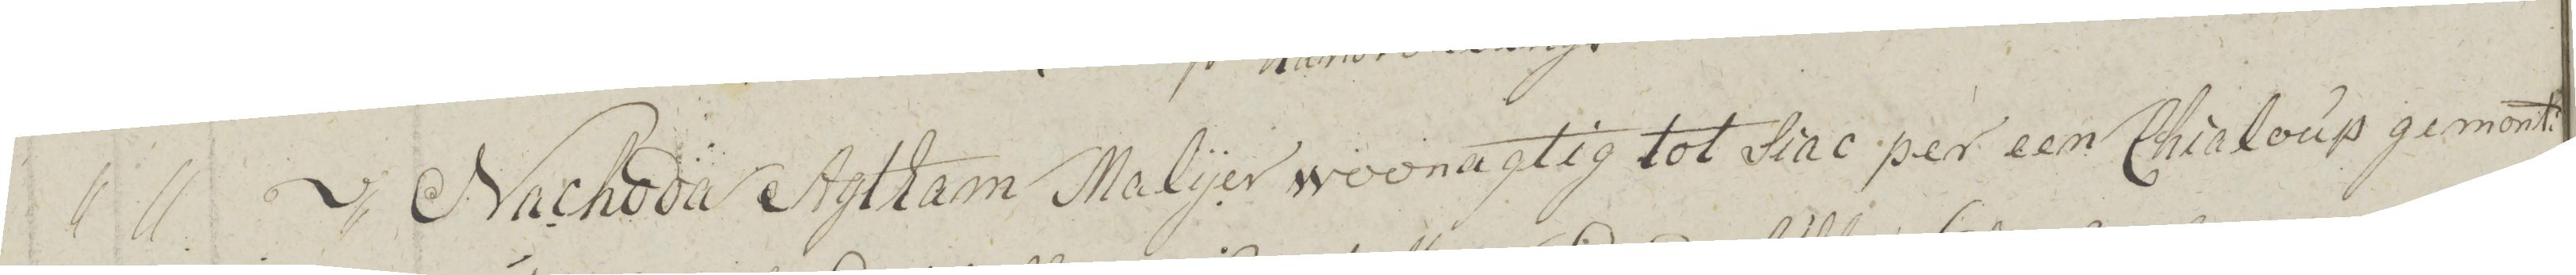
„ „ D„' Nachoda Agtham Malijer woonagtig tot Siac per een Chialoup gemont:
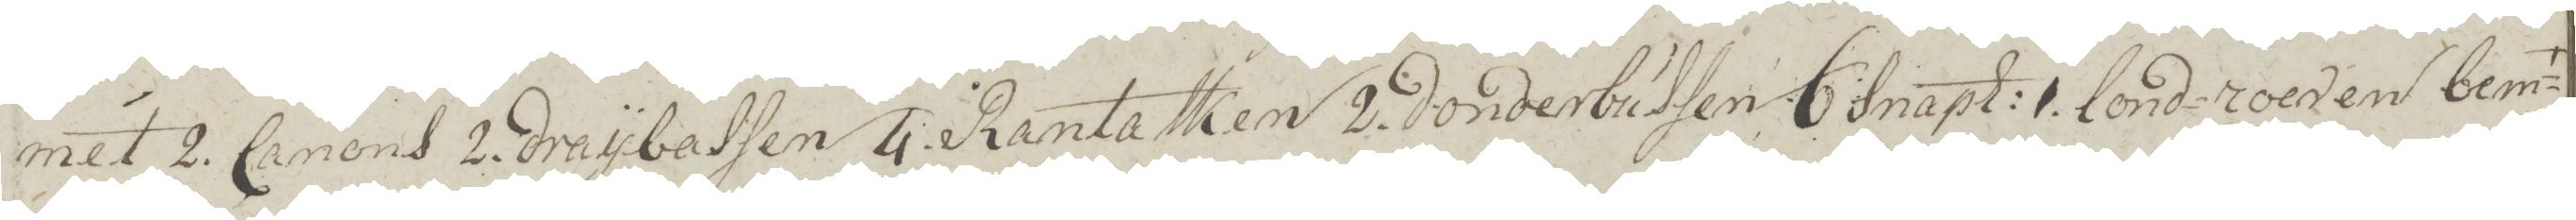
met 2. Canons 2. draijbassen 4: Rantakken 2. donderbussen 6 snaph: 1. lond=roeden bem:t
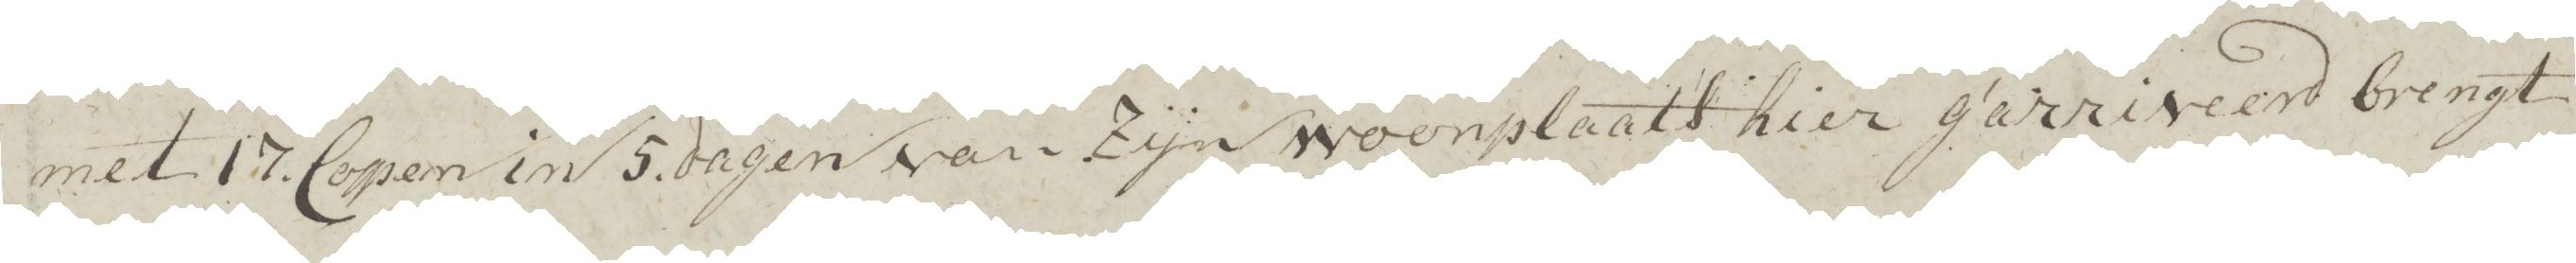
met 17. Coppen in 5. dagen van Zijn woonplaats hier g'arriveerd brengt
